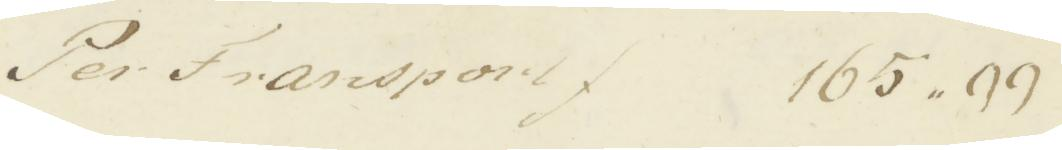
Per Transport ƒ 165„99
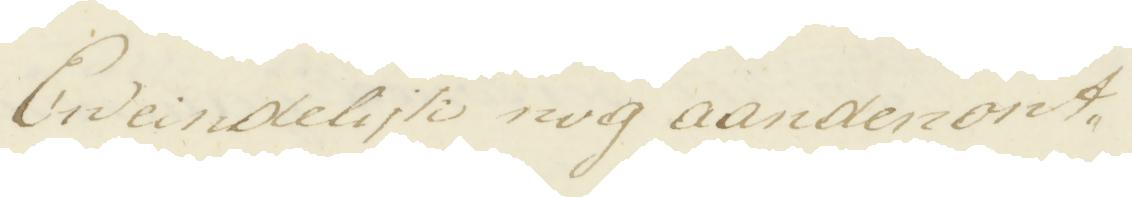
En eindelijk nog aan den ont„
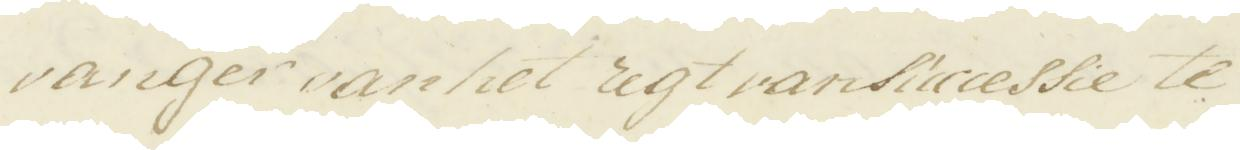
vanger van het regt van successie te
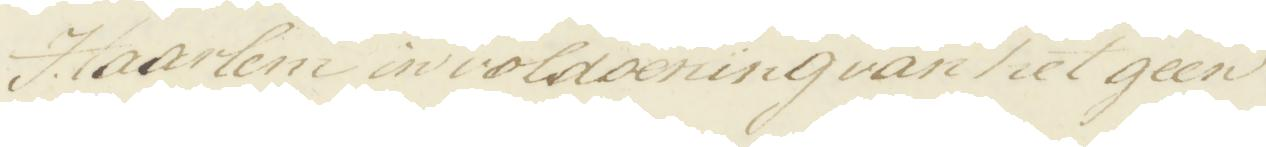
Haarlem in voldoening van het geen
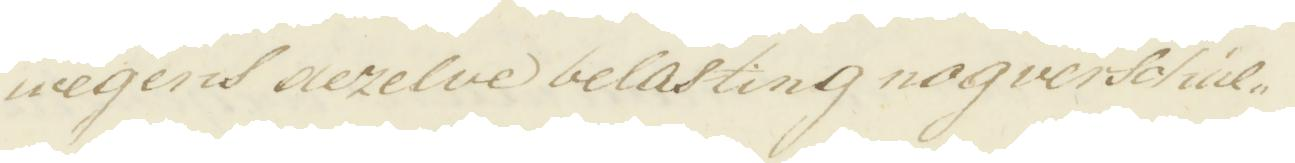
wegens dezelve belasting nog verschul„
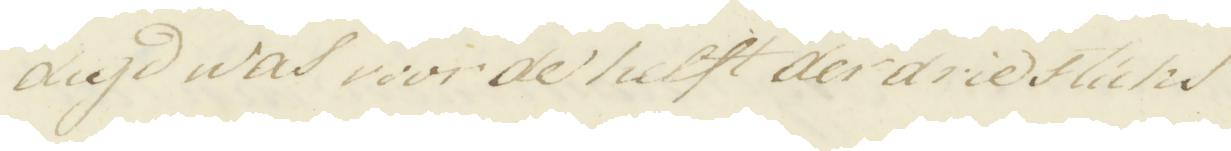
digd was voor de helft der drie stuks
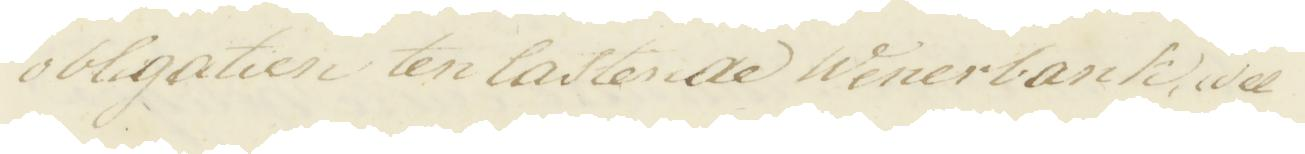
obligatien ten lasten de Wenerbank, wel
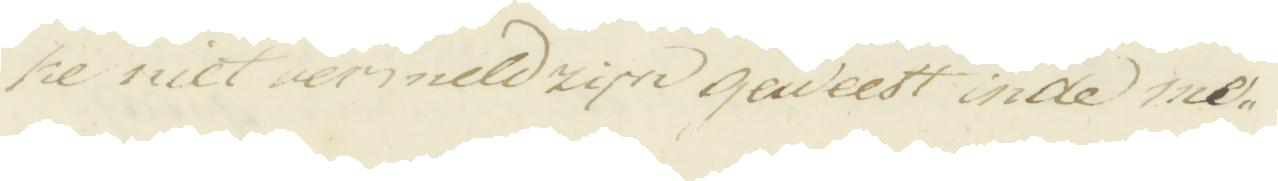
ke niet vermeld zijn geweest inde me„
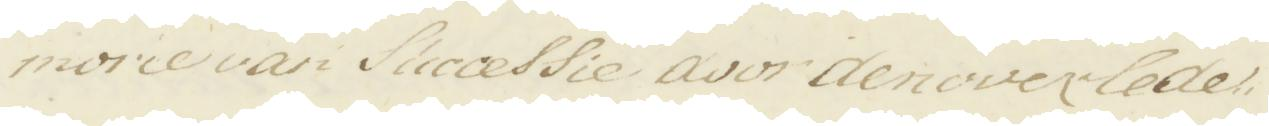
morie van successie door den overlede„
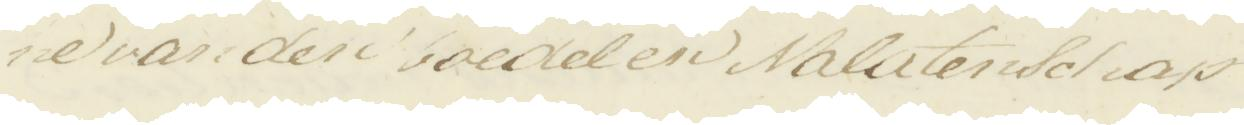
ne van den boedel en Nalatenschap
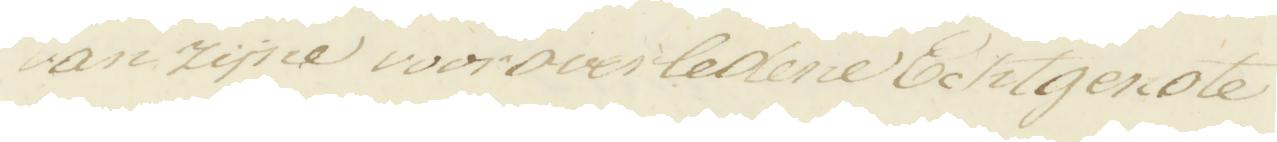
van zijne voor overledene Echtgenote
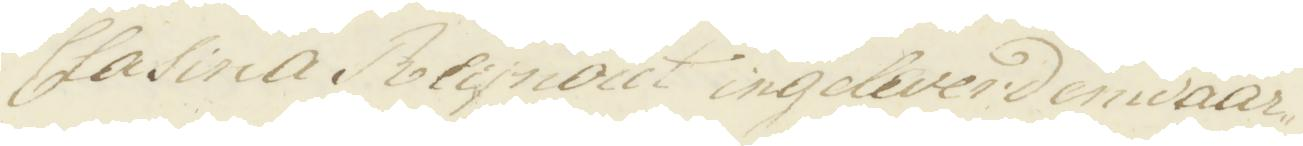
Clasina Reijnout ingeleverd en waar„
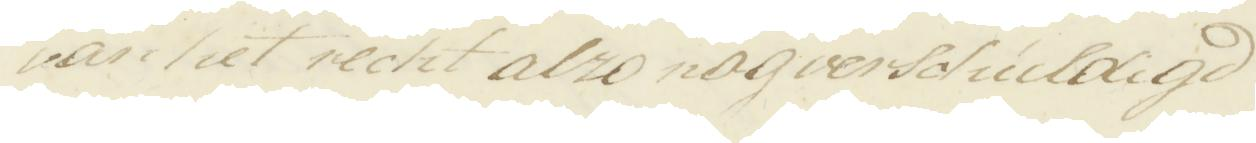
van het recht alzo nog verschuldigd
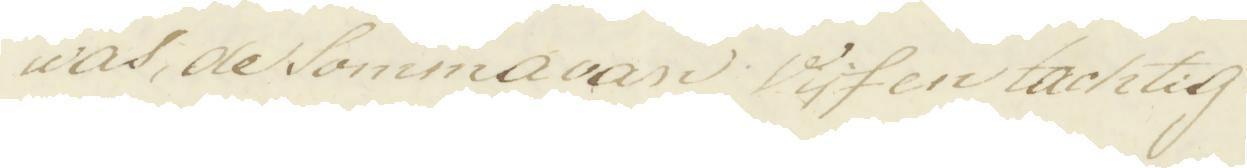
was, de somma aan Vijf en tachtig
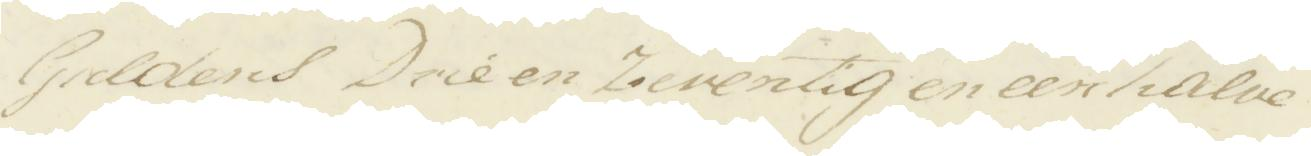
Guldens Drie en zeventig en een halve
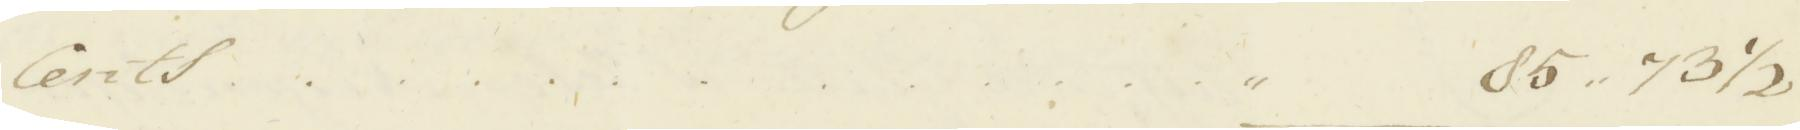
Cents . . . . . . . . . . . . . „ 85 „ 73½
